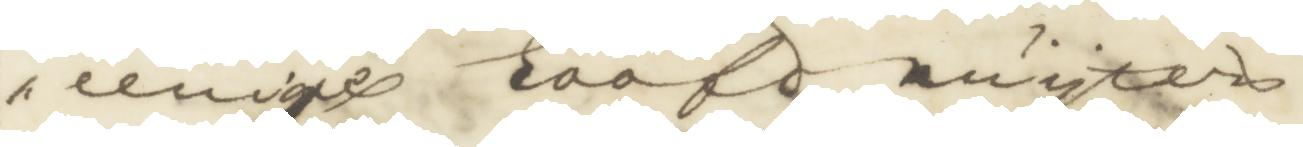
„eenige hoofd ruijter
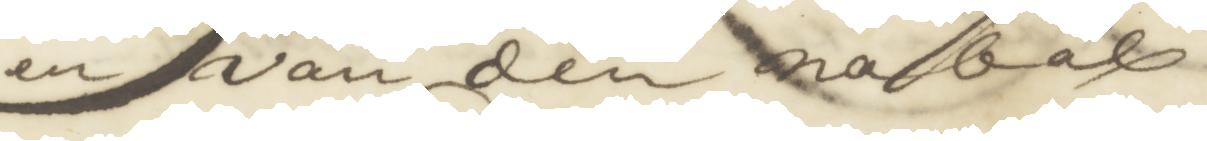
en van den nabal
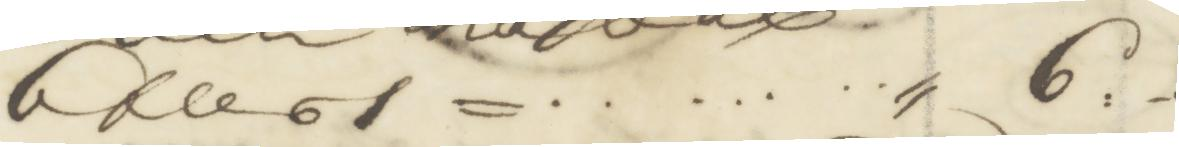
6fless =. . . . . . .„ 6:-
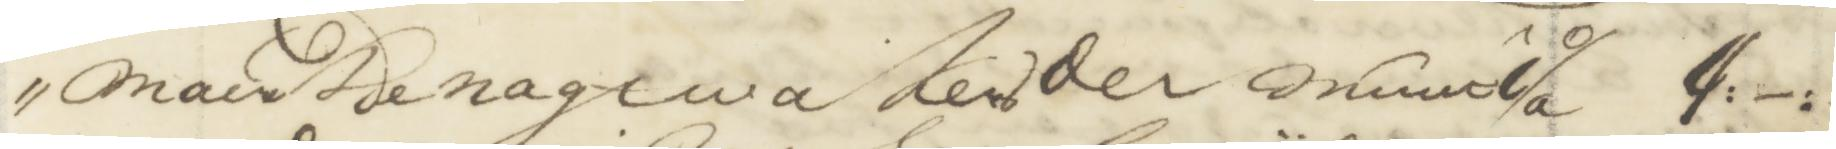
„maert de nagtwaker der munt ro/a 4:–:
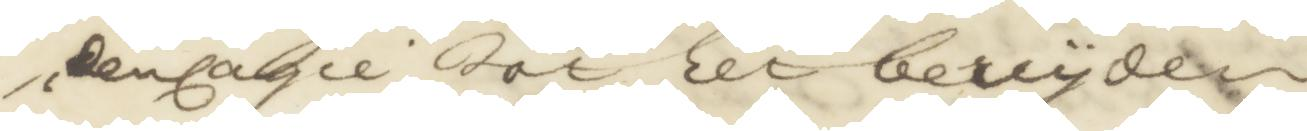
„dencagie tot het bereijden
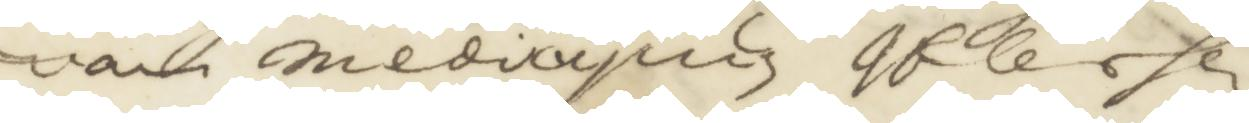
van medicijnen 4flessen
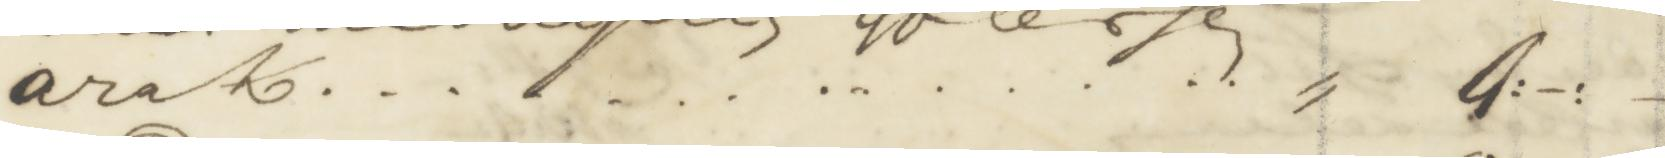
arak. . . . . . . . .. . . . . . „ 4:–:-
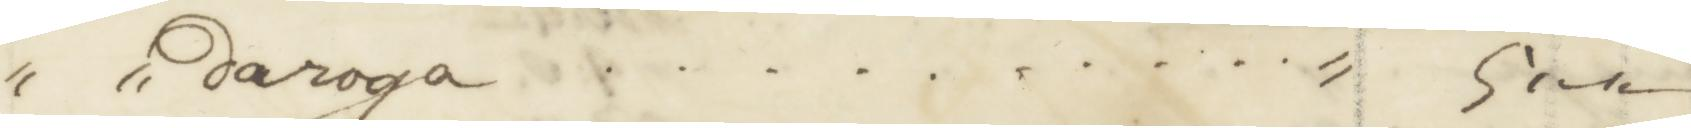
„ „ daroga . . . . . . . . . .„ 5,-„–
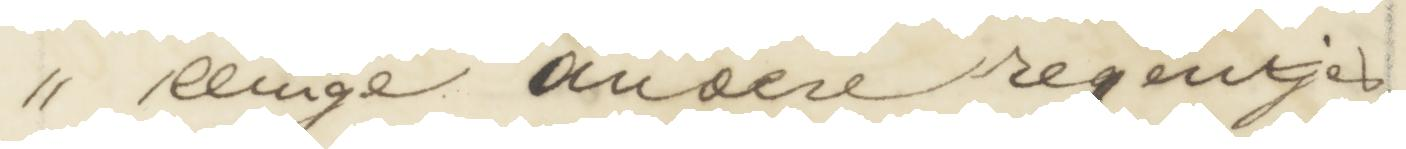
„ ,eenige andere regentjes
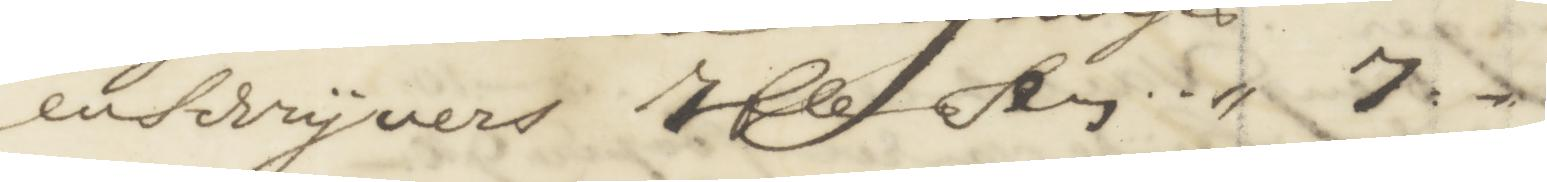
en schrijvers 7flessen..„ 7:-
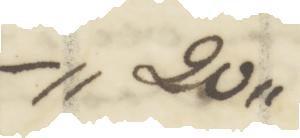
„ 20
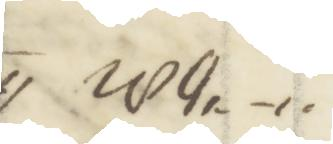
„ 189„-„
